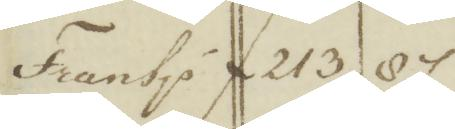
Transp ƒ 213 87
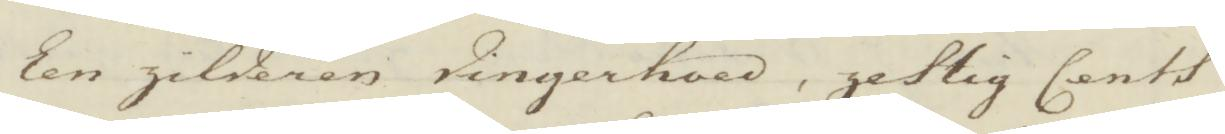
Een zilveren Vingerhoed, zestig Cents
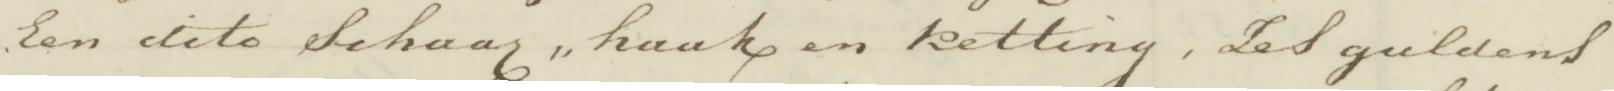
hen dito schaar, haak en ketting, Zes guldens
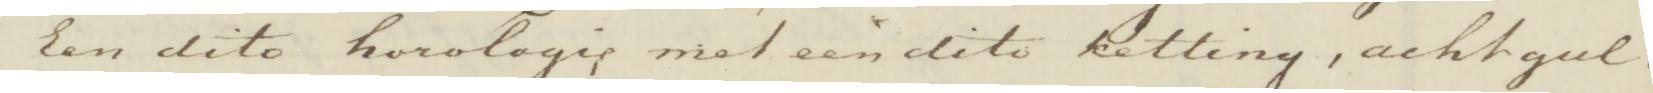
Een dito horologie met een dito ketting, acht gul„
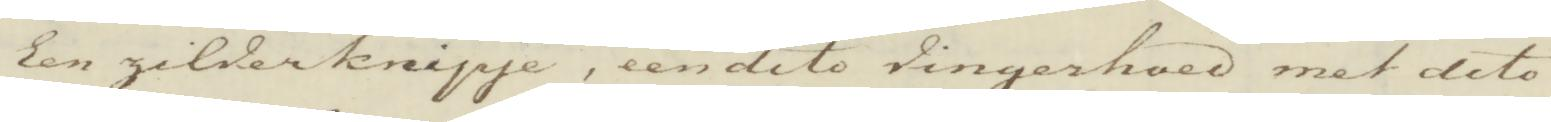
Een zilver knipje, een dito vingerhoed met dito
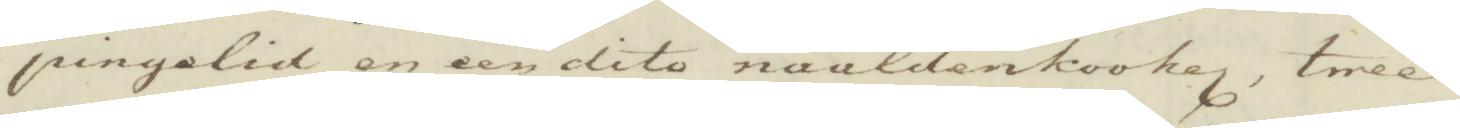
pingelid en een dito naaldenkooker, twee
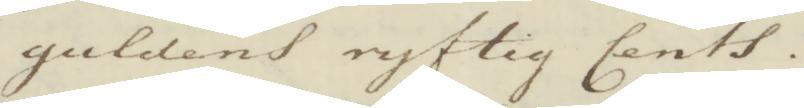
guldens vyftig Cents.
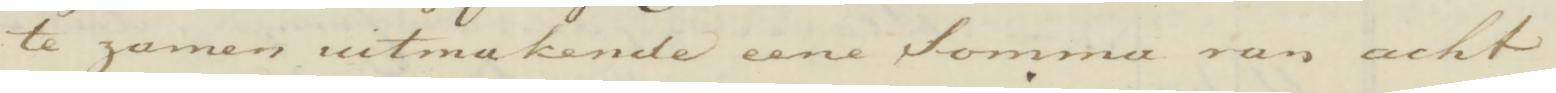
te zamen uitmakende eene Somma van acht
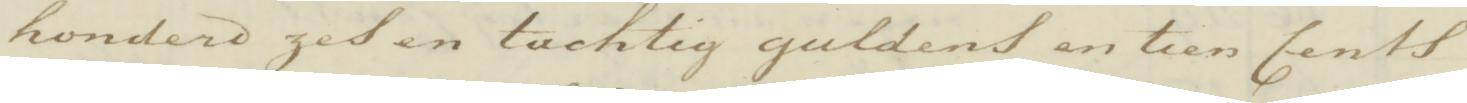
honderd zes en tachtig guldens en tien Cents
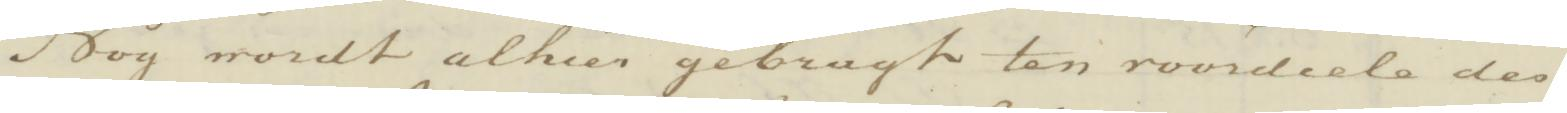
Nog wordt alhier gebragt ten voordeele des
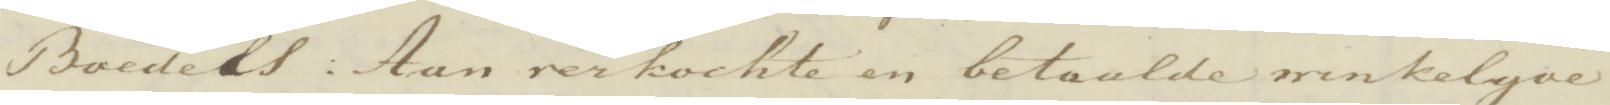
Boedels: Aan verkochte en betaalde winkelgoe
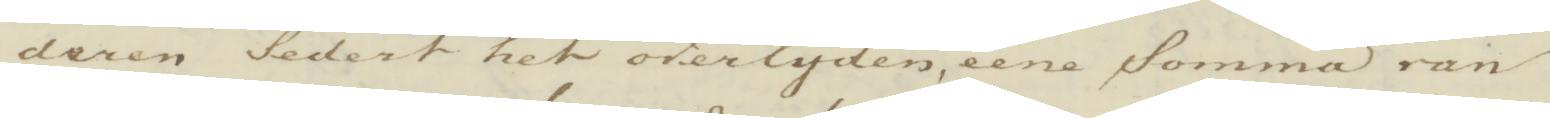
deren Sedert het overlyden, eene Somma van
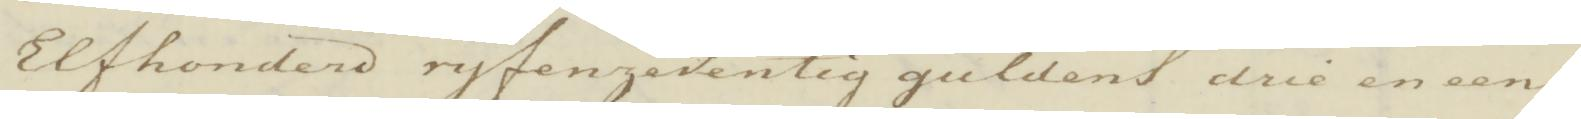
Elfhonderd vyf en zeventig guldens drie en een
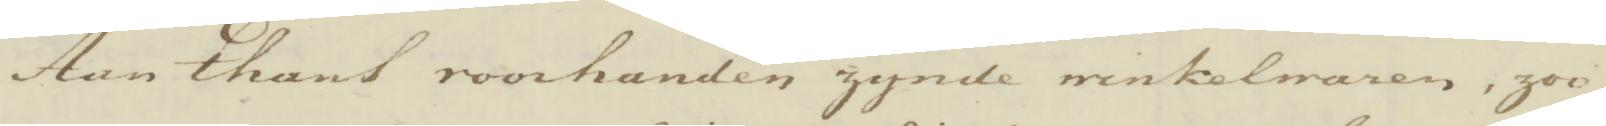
Aan thans voorhanden zynde winkelwaren; zoo
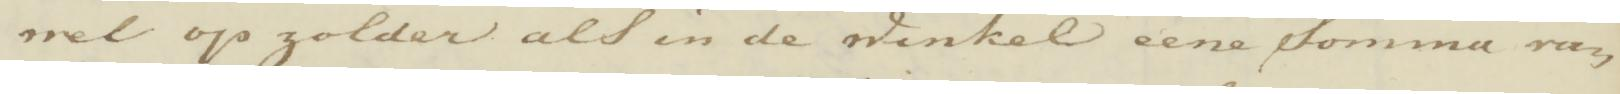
wel op zolder als in de winkel eene Somma van
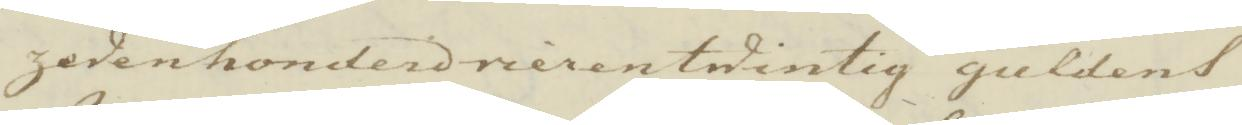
zeven honderd vier en twintig guldens
